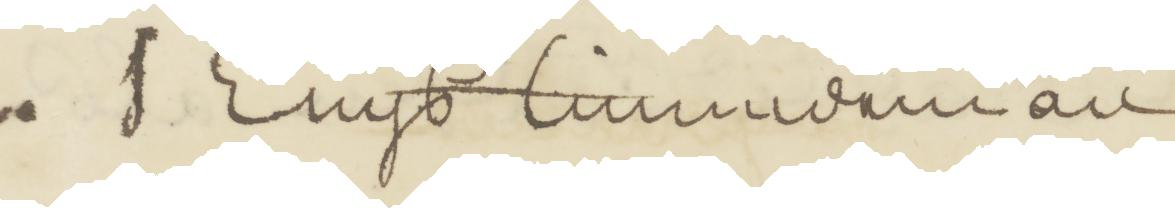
1 huijs timmerman
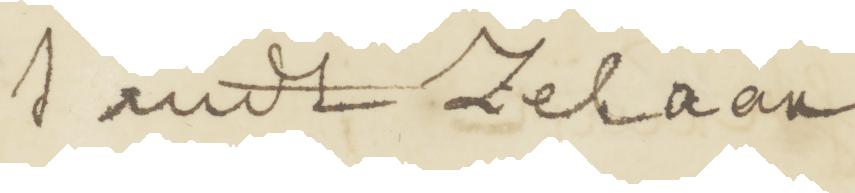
1 metzelaar
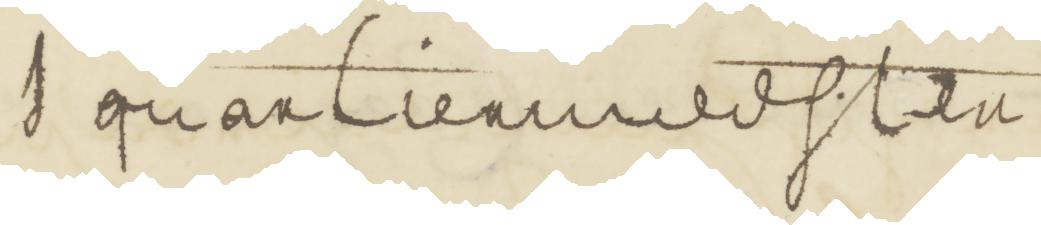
1 quartiermeester
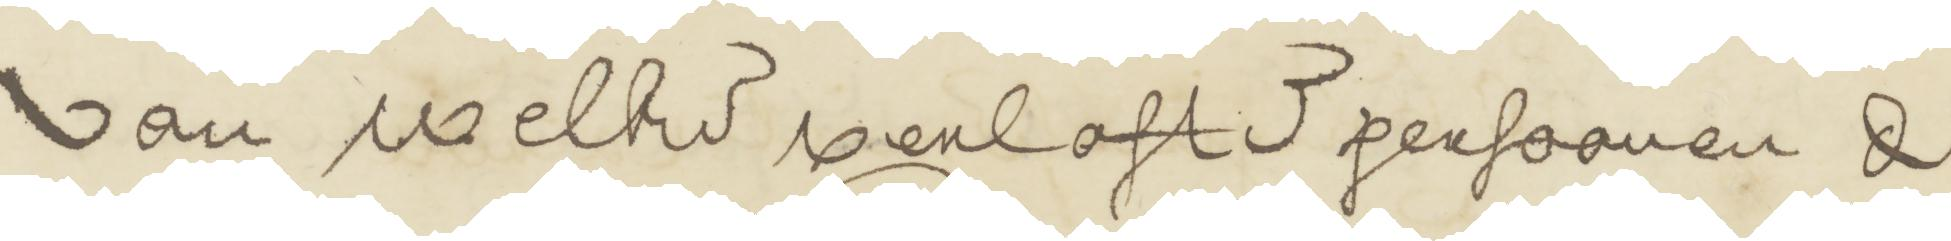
Van welke verloste persoonen de
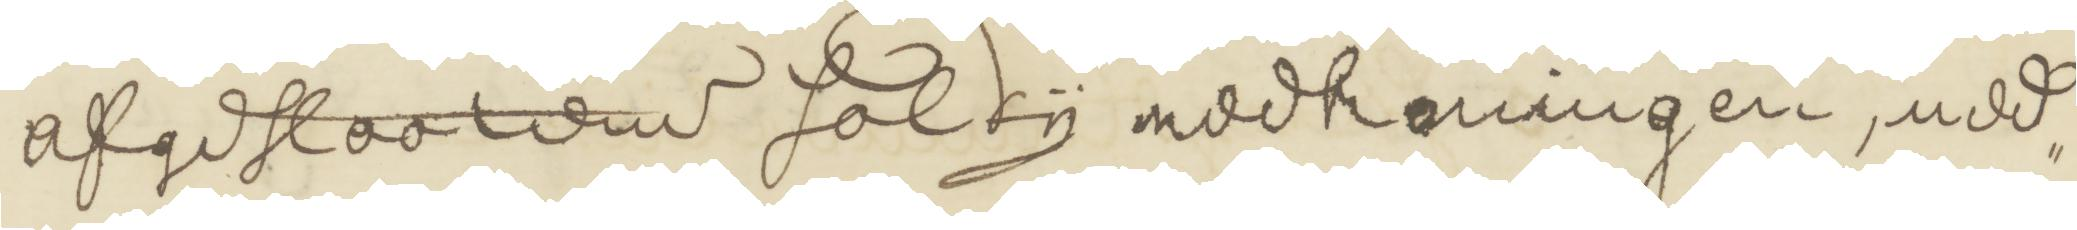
afgeslootene soldij reekeningen, nee„
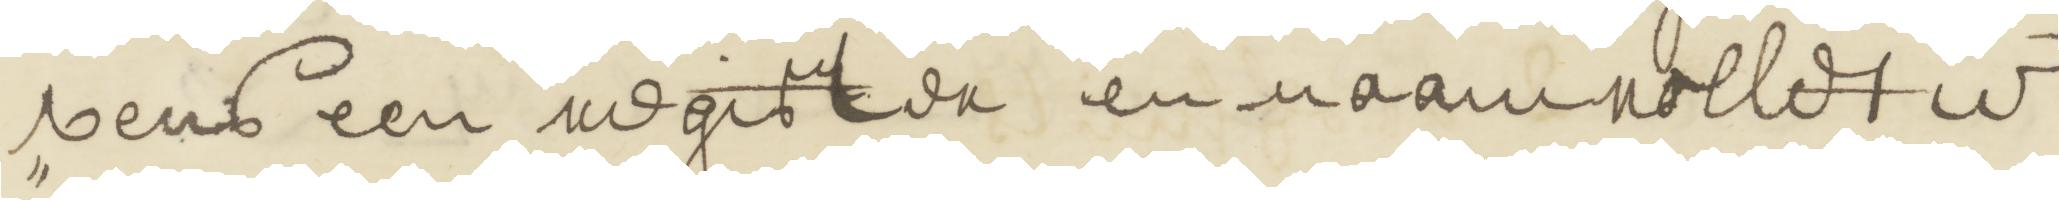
„vens een register en naamrolletie
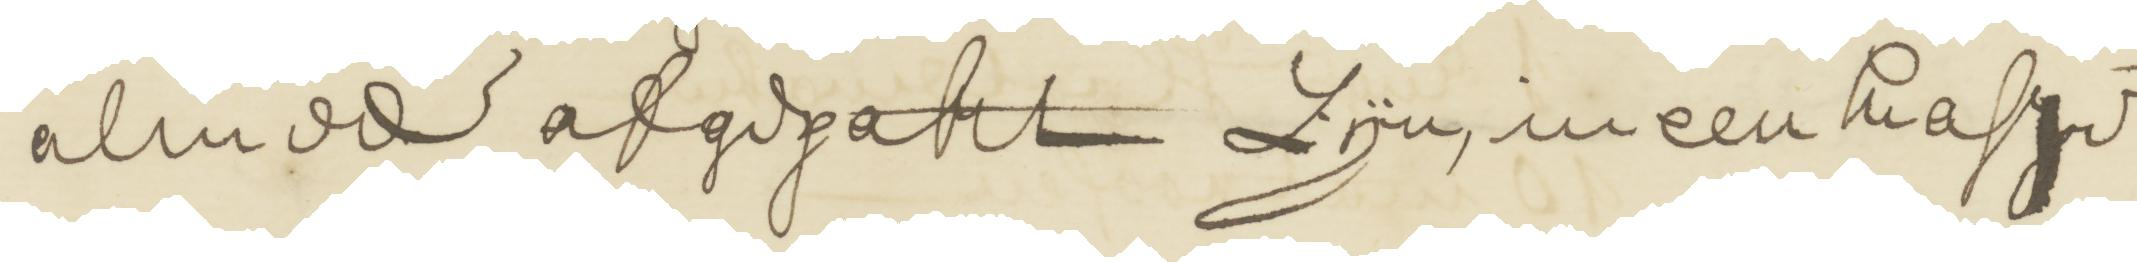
almede afgepakt zijn, in een kasje
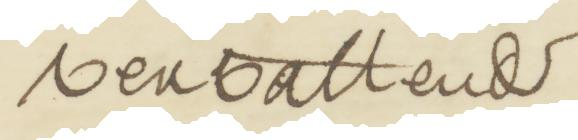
vervattende
